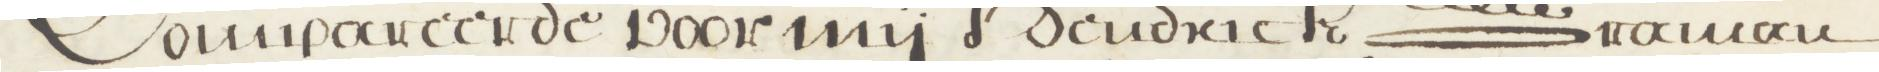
Compareerde voor mij Hendrick Graman
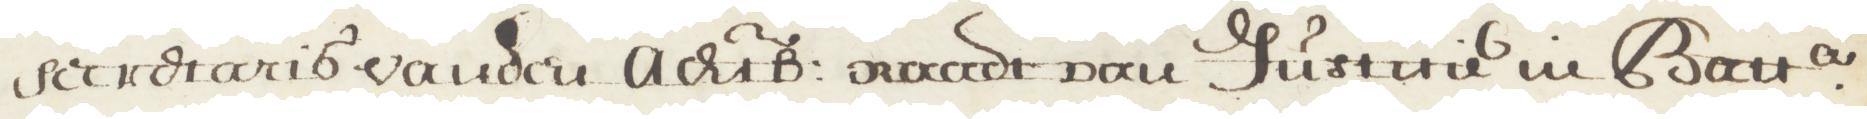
secretaris vanden achtb: Raadt van Justitie in Batt.a
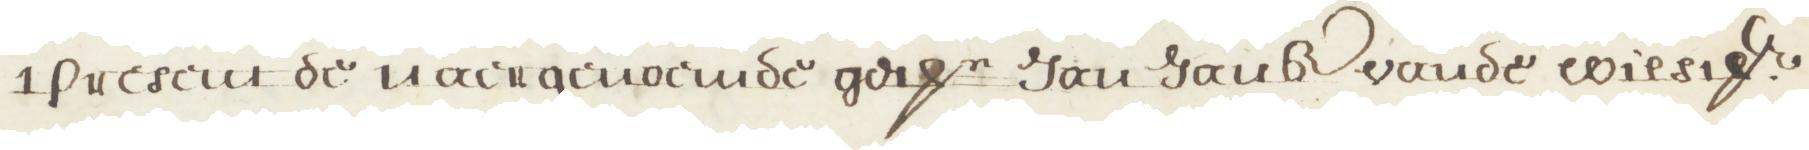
present de naergenoemde get/n Jan Ians vande wilst/r
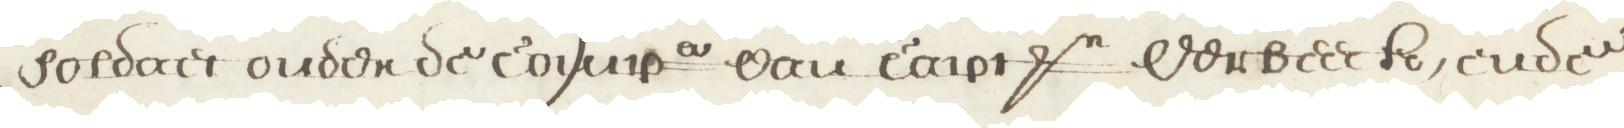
soldaet onder de comp=a van capt/n verbeeck, ende
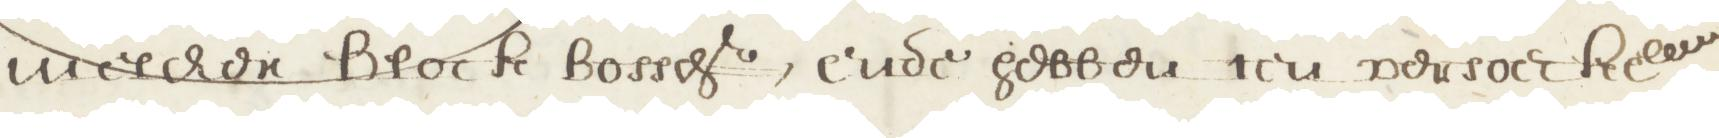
melcher block bossch=r, ende hebben ten versoecke
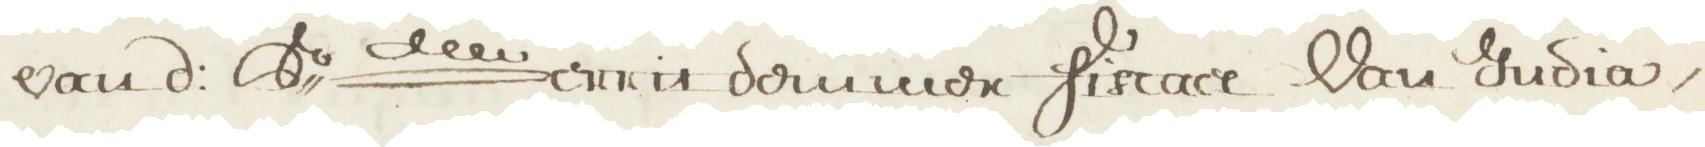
van d: h„r Gerrit demmer fiscael Van India,
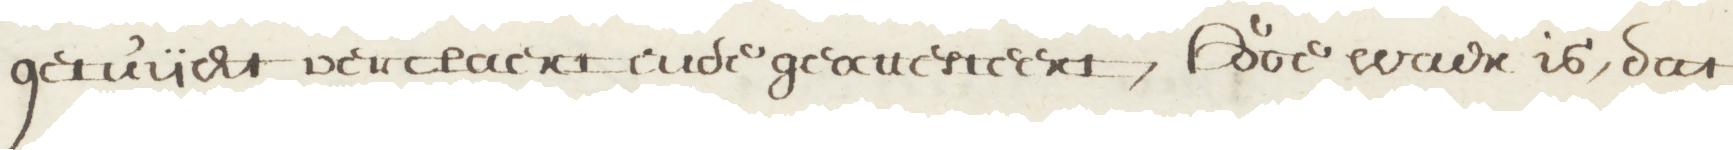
getuijcht verclaert ende geattesteert, hoe waer is, dat
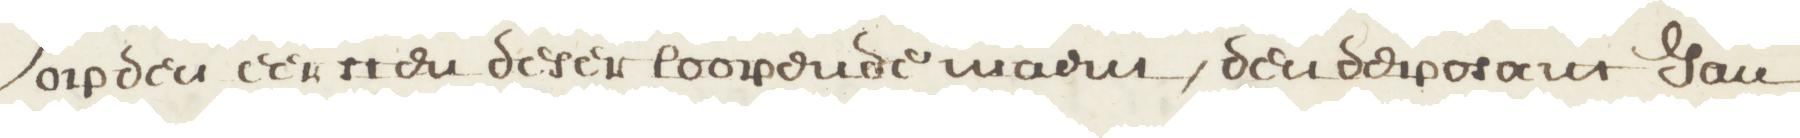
op den eersten deser loopende maent, den deposant Jan
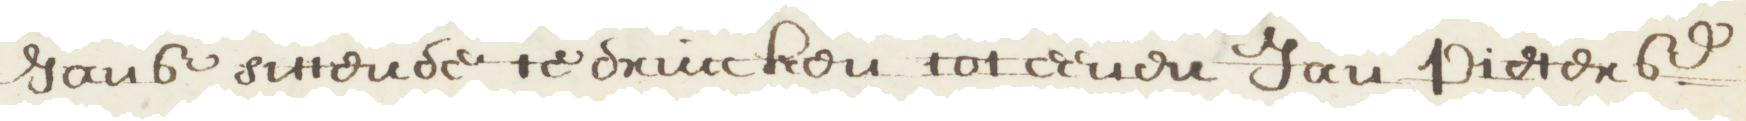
Jans sittende te drincken tot eenen Jan Pieters=e
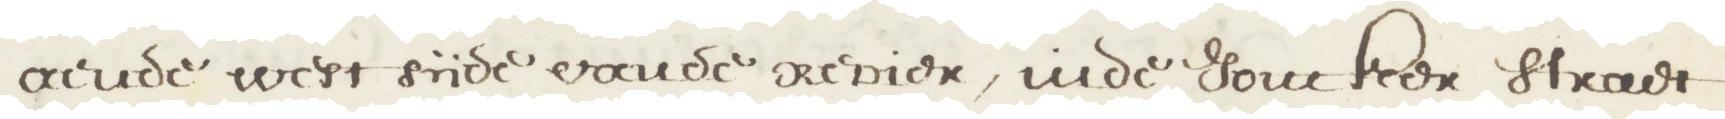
aende west sijde van de revier, in de Ioncker straet
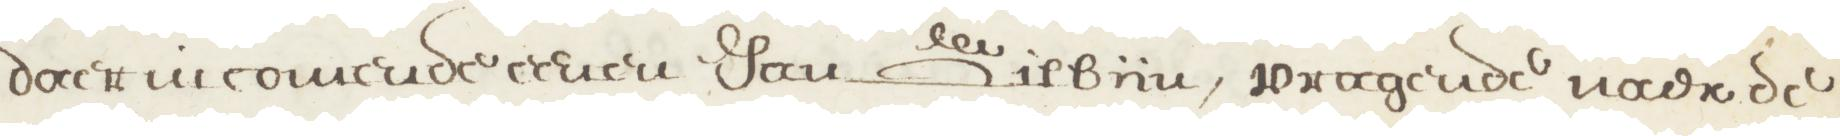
daer incomende eenen Jan Gilbijn, vragende naer de
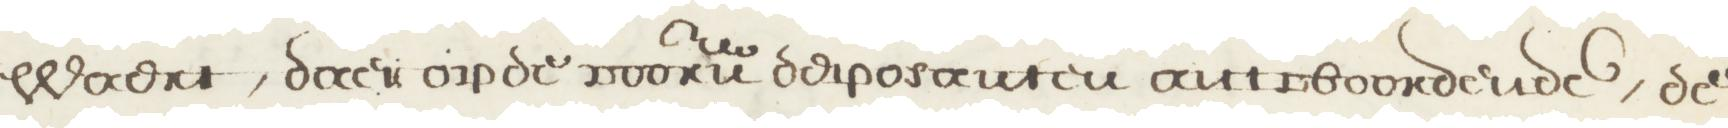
Waert, daer op de voorn deposanten antwoordende, de
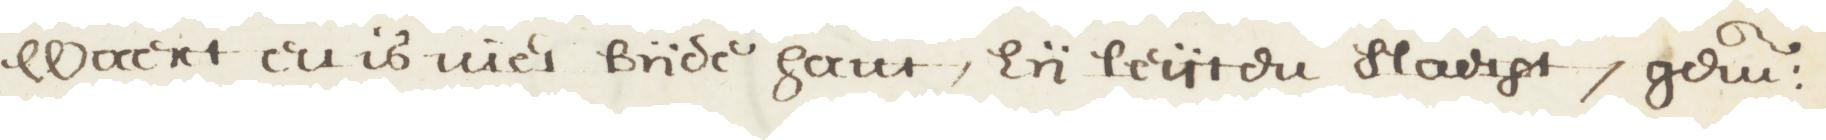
Waert en is niet bijde hant, hij leijten slaept, gem:
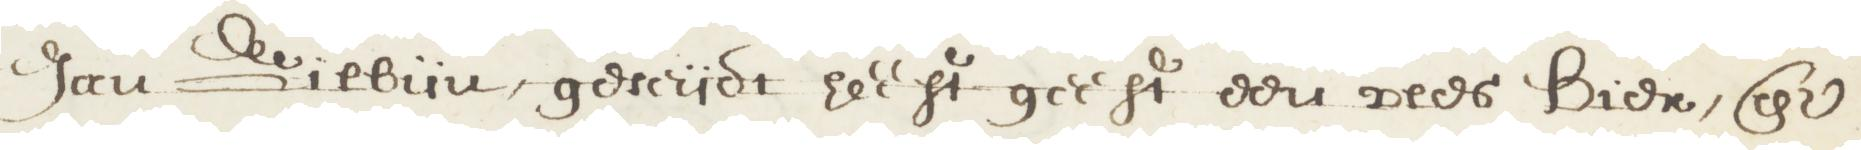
Jan Gilbijn, geseijdt heeft geeft een vles Bier, ende
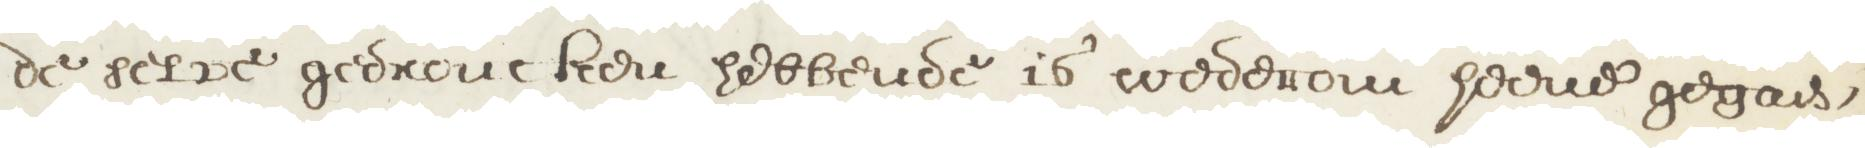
de selve gedroncken hebbende is wederom heene gegaen,
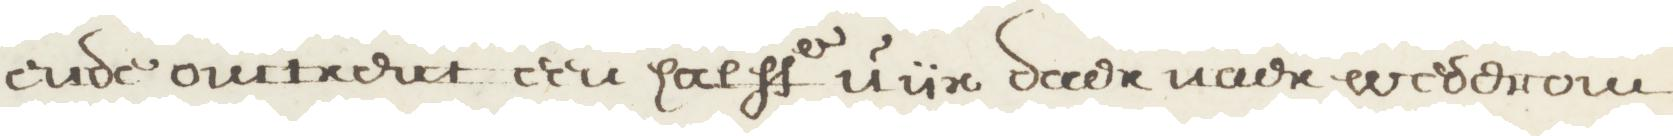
ende omtrent een halff uijr daer naer wederom
